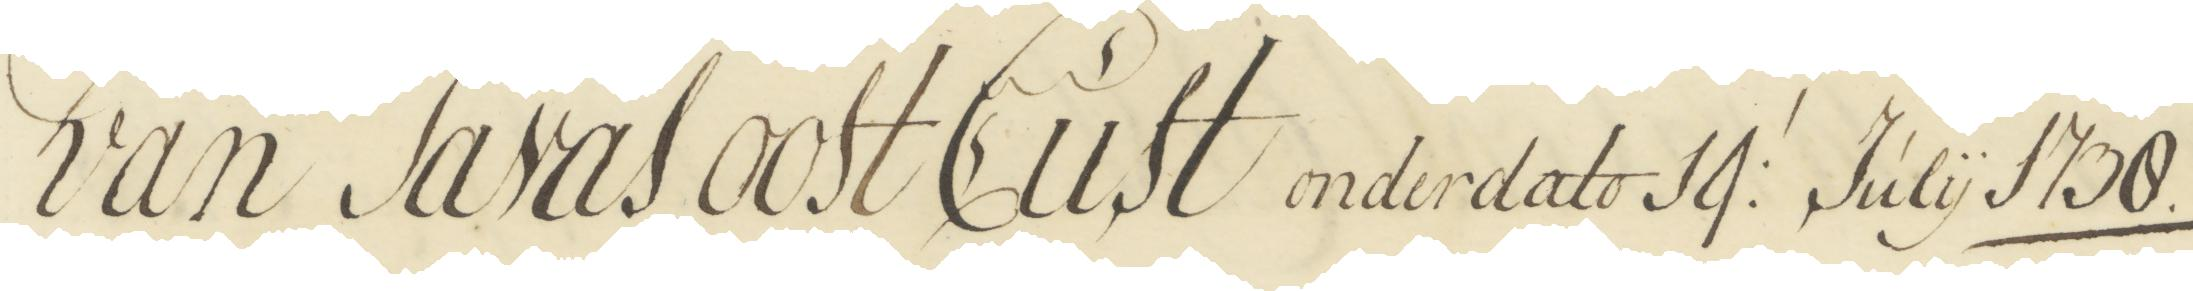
Van Iava's oost Cust onder dato 14:' Iulij 1738.
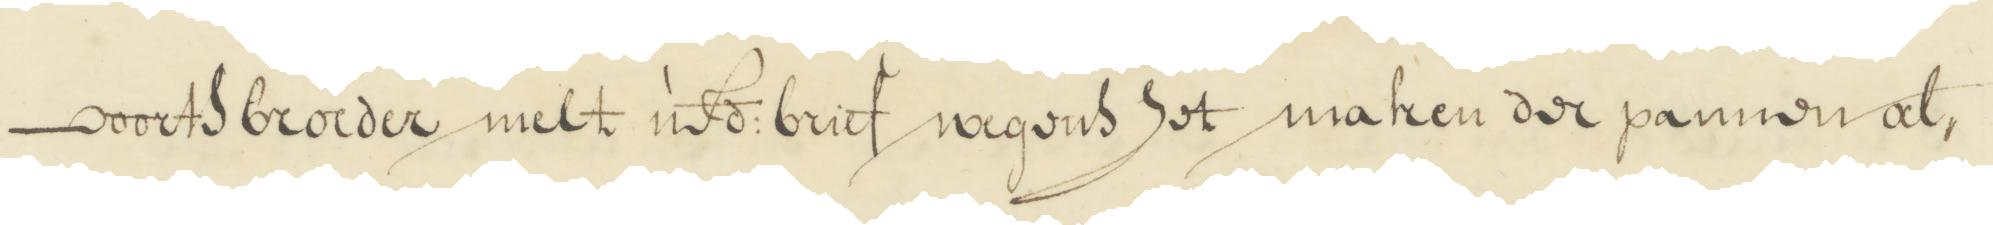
voorts broeder melt uEd: brief wegens het maken der pannen al„
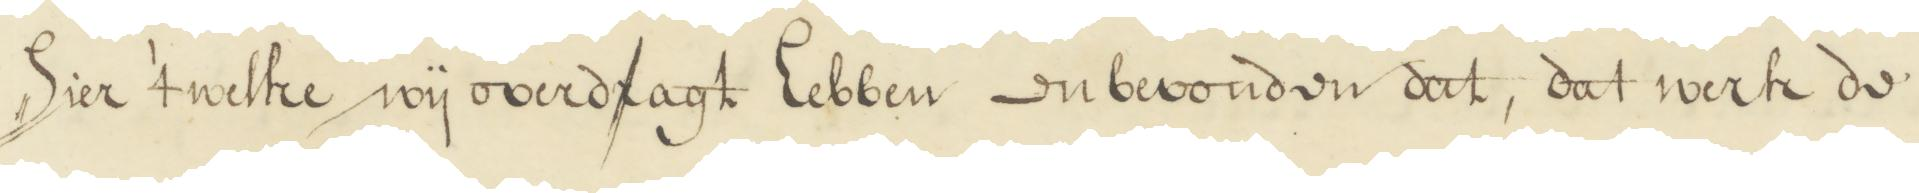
„hier ’t welke wij overdragt hebben en bevonden dat, dat werk de
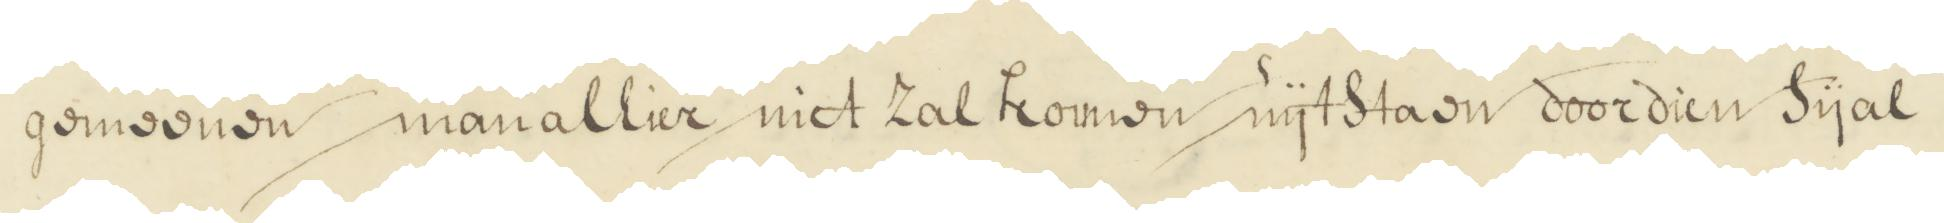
gemeenen manalhier niet zal konnen uijtstaen doordien sijal
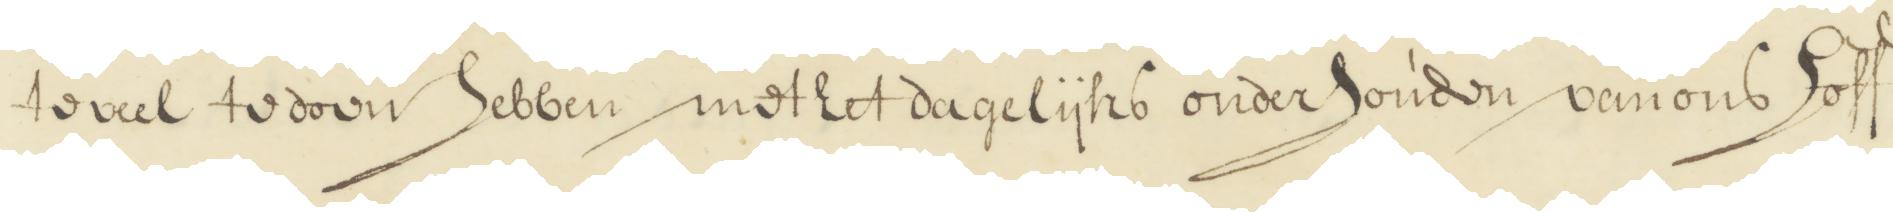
teveel te doen hebben met het dagelijks onderhouden van ons hoff
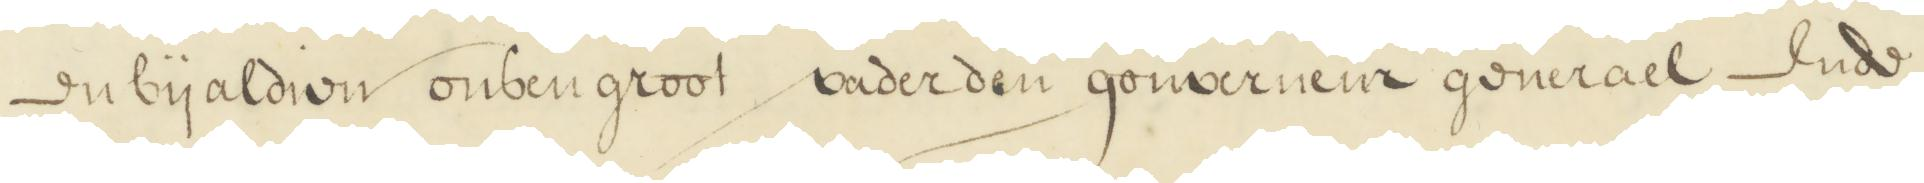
en bij aldien onsen groot vader den gouverneur generael ende
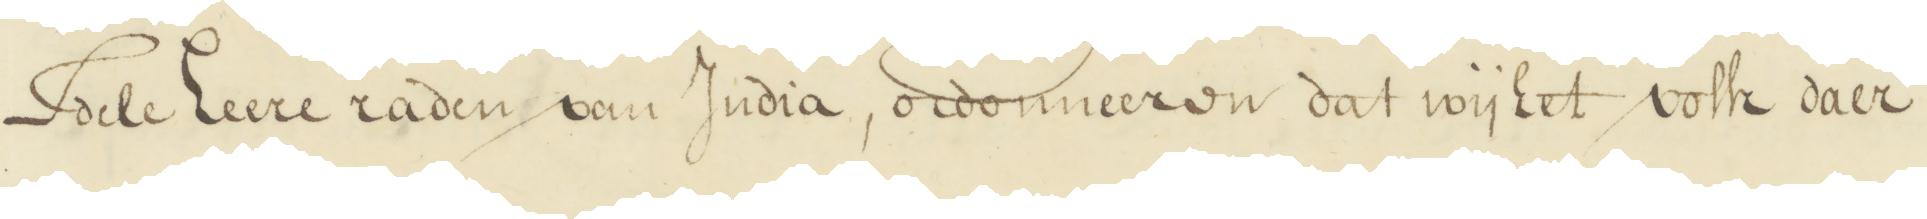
Edele heere raden van Jndia, ordonneeren dat wij het volk daer
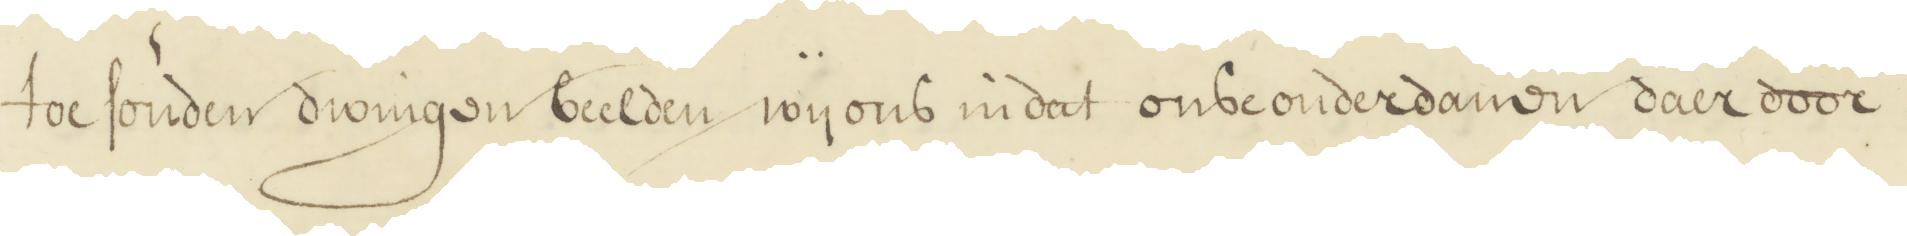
toe souden dwingen beelden wij ons in dat onse onderdanen daer door
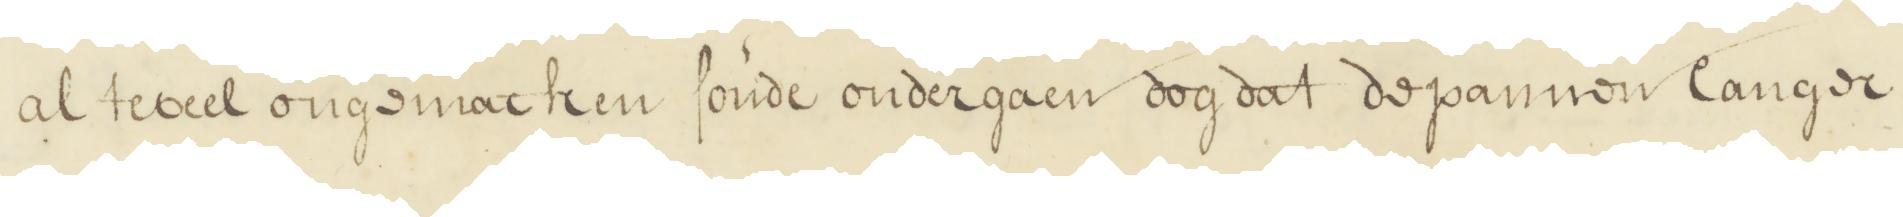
al teveel ongemacken soude ondergaen dog dat de pannen langer
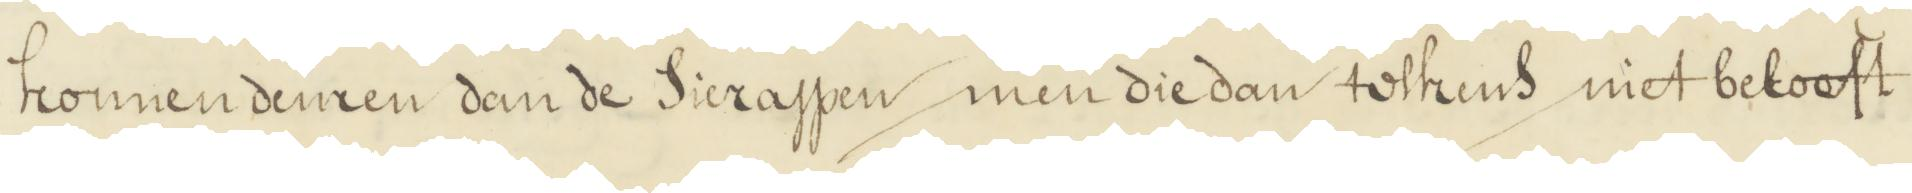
konnen deuren dan de sierappen men die dan telkens niet behooft
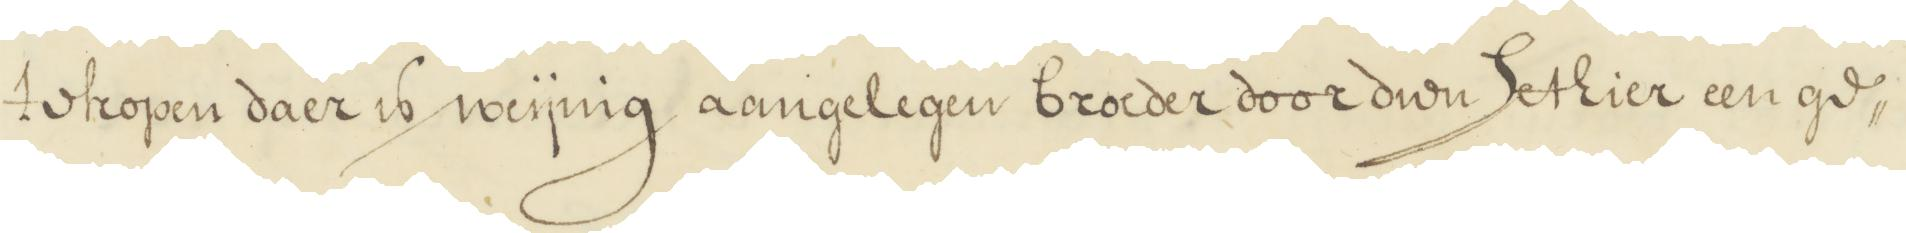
tekopen daer is weijnig aangelegen broeder door dien hethier een ge„
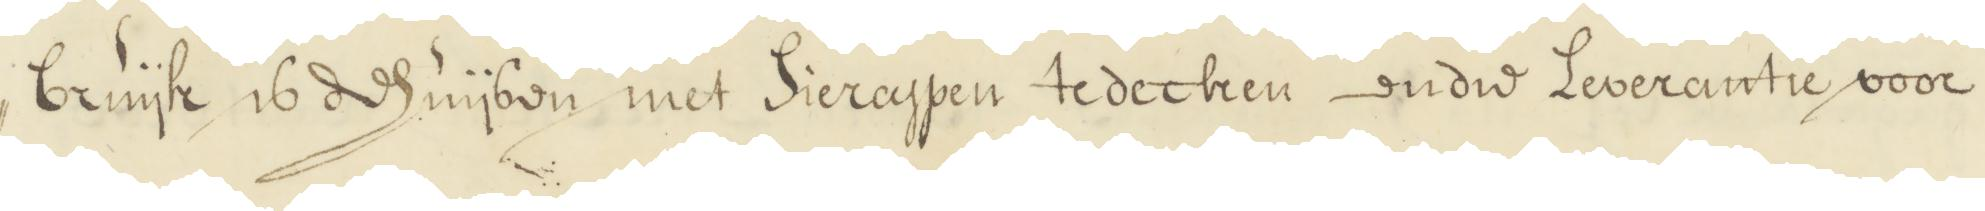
„bruijk is dehuijsen met sierappen te decken en die leverantie voor
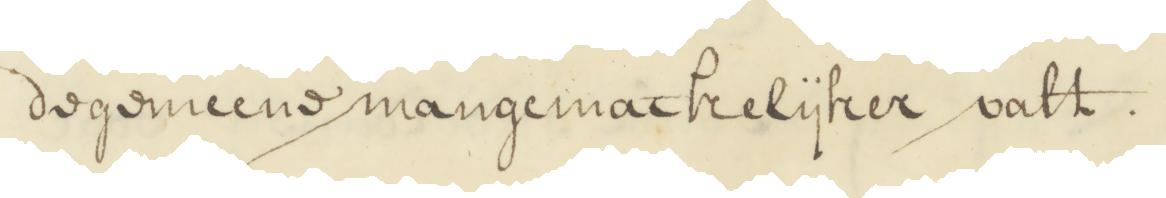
de gemeene mangemackelijker valt.
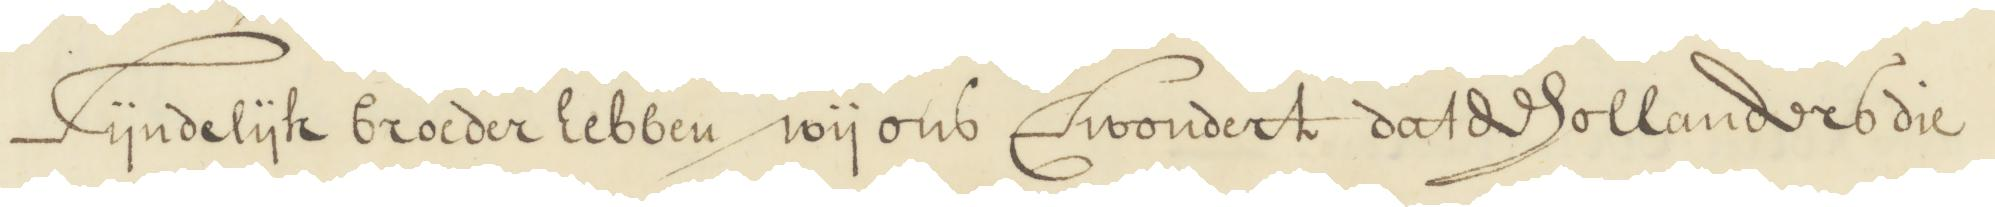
Eijndelijk broeder hebben wij ons verwondert dat de hollanders die
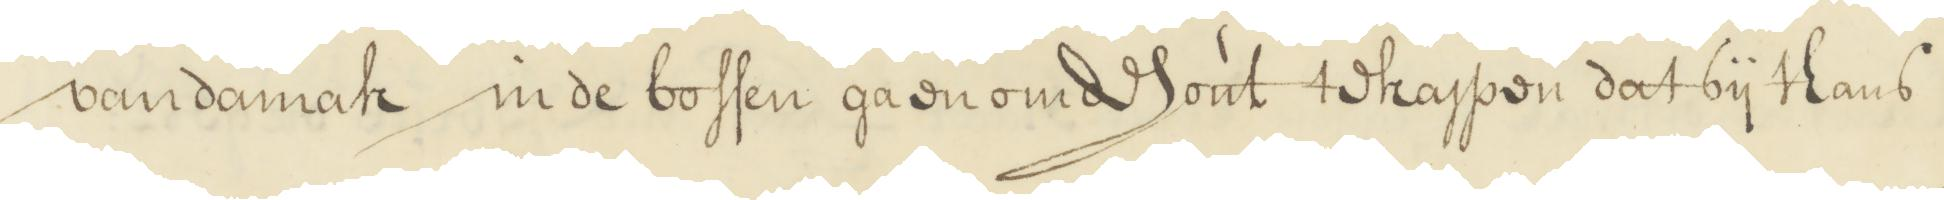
van damak in de bossen gaen om de hout tekappen dat bij thans
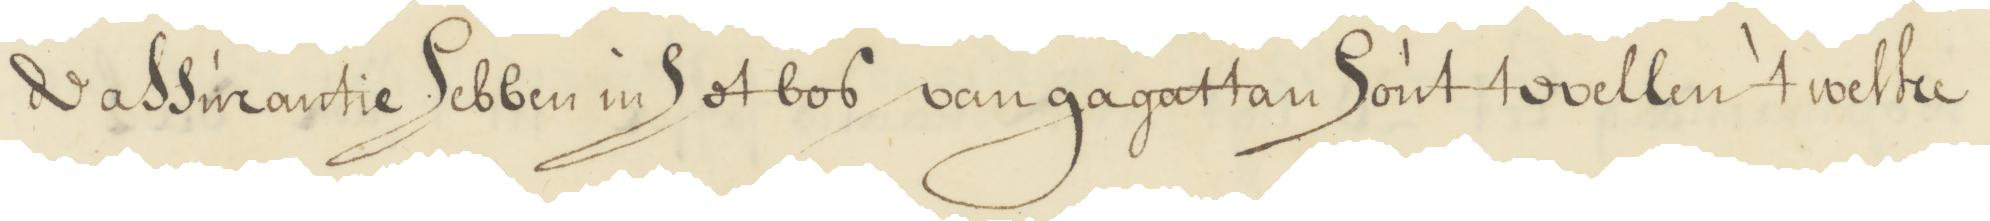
de assurantie hebben in het bos van gagattan hout tevellen 't welke
